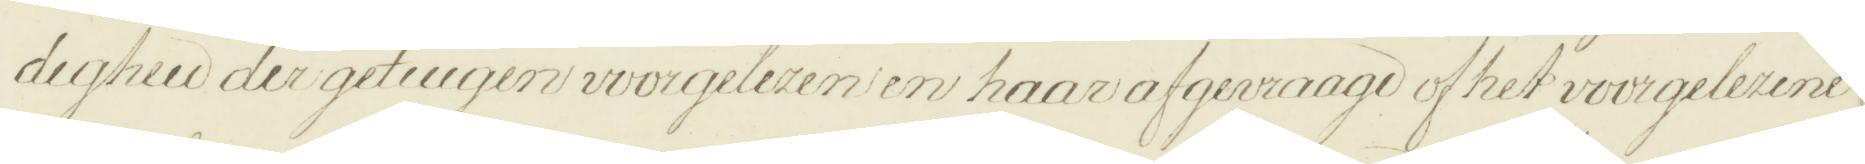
digheid der getuigen voorgelezen en haar afgevraagd of het voorgelezene
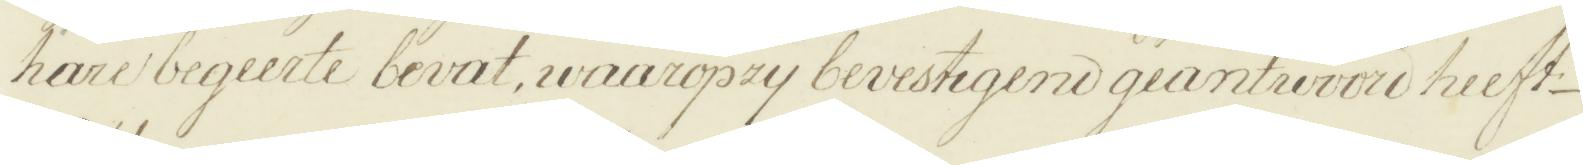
hare begeerte bevat, waarop zy bevestigend geantwoord heeft-
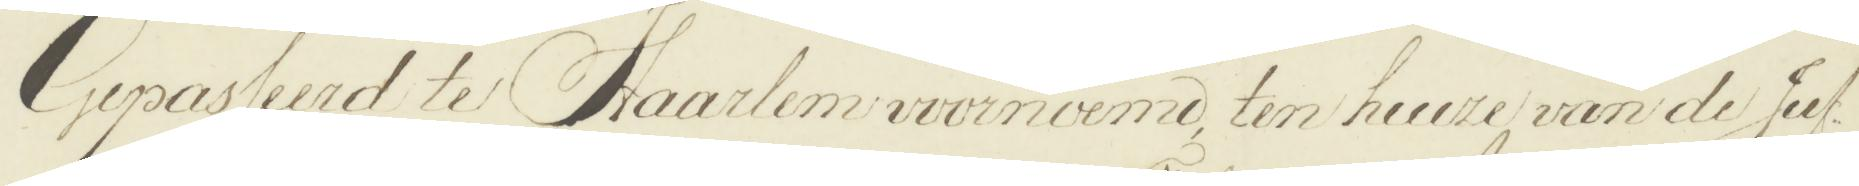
Gepasseerd te Haarlem, voornoemd, ten huize van de Juf„
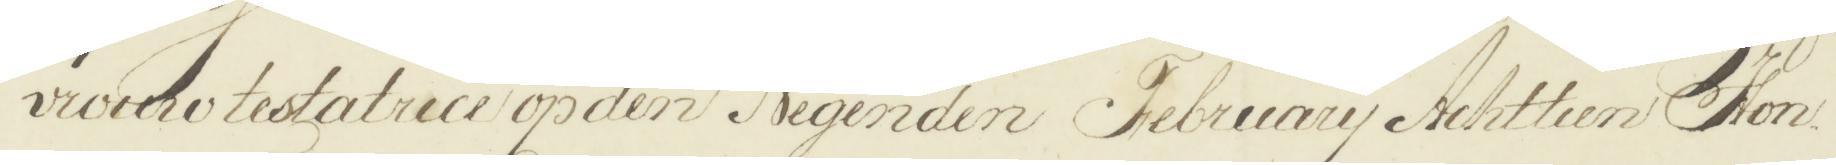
vrouw testatrice op den Negenden February Achttien Hon„
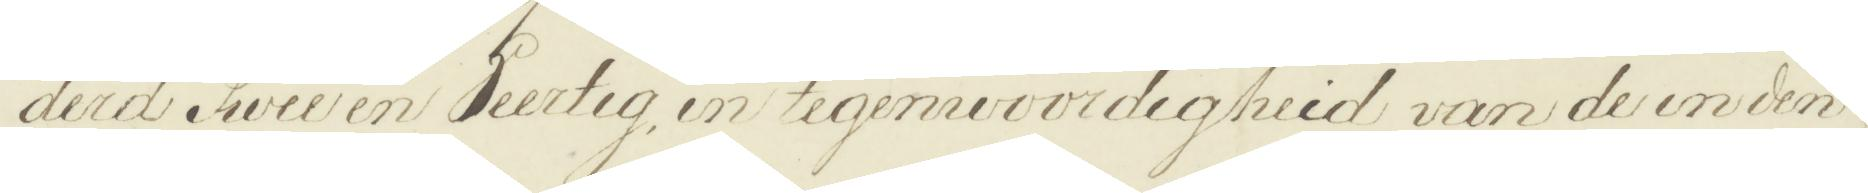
derd Twee en Veertig, in tegenwoordigheid van de in den
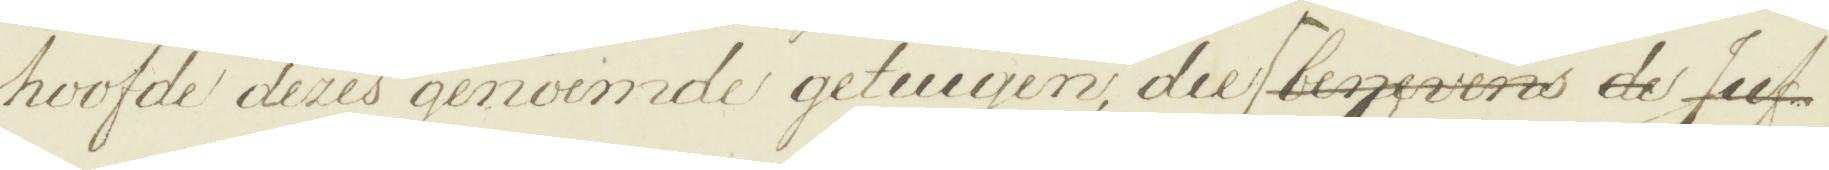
hoofde dezes genoemde getuigen, die ¶ benevens de Juf„
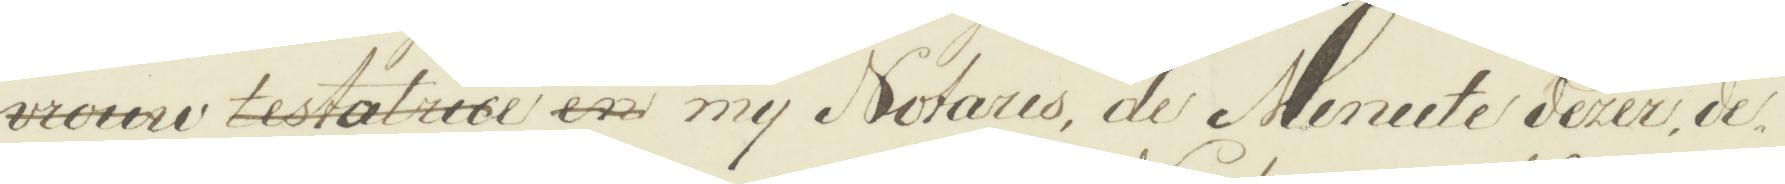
vrouw testatrice en my Notaris, de Minute dezer, de„
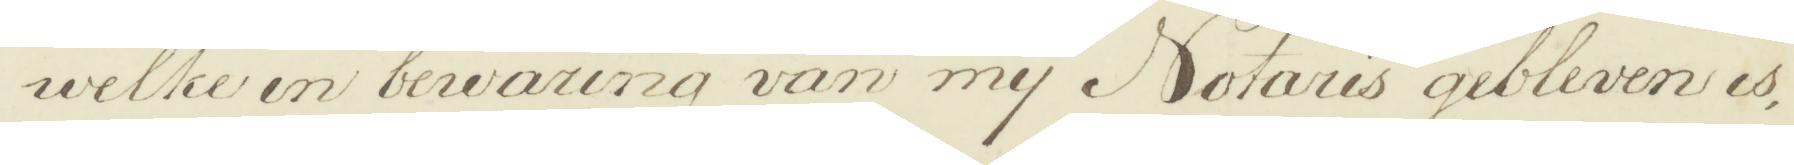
welke in bewaring van mij Notaris gebleven is,
